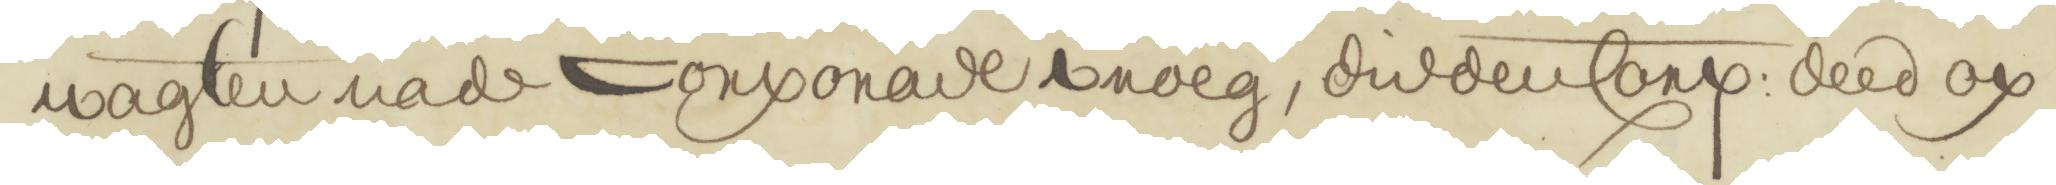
wagten nade Corporael vroeg, die den corp: deed op
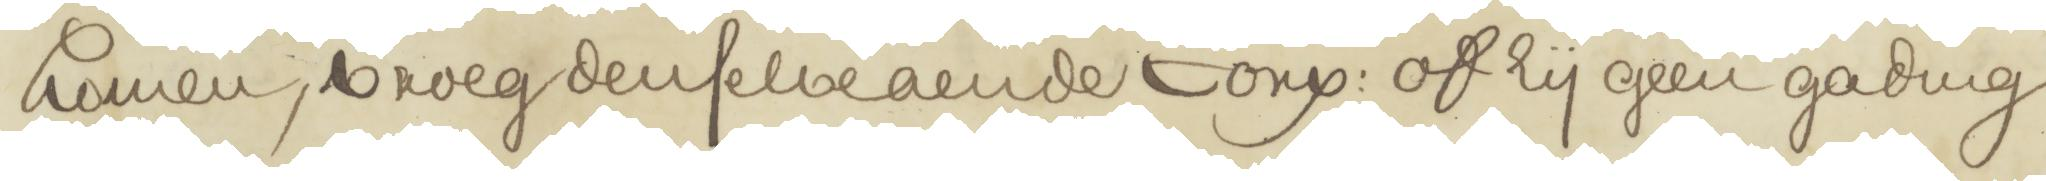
komen, vroeg denselve aende Corp: of hij geen gading
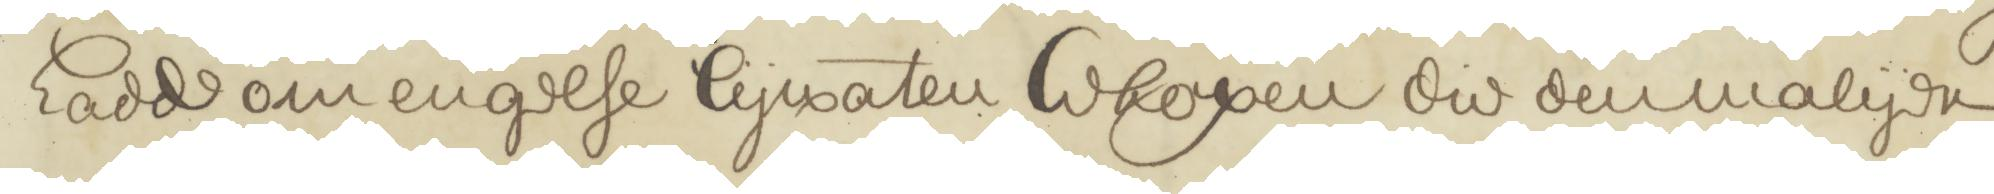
hadde om engelse lijwaten tekopen die den malijer
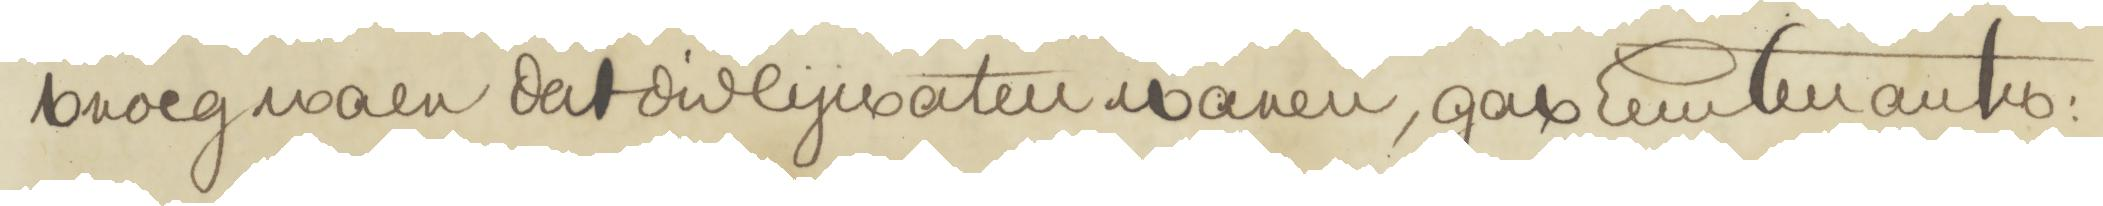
vroeg waer dat die lijwaten waren, gav hem ten antw:
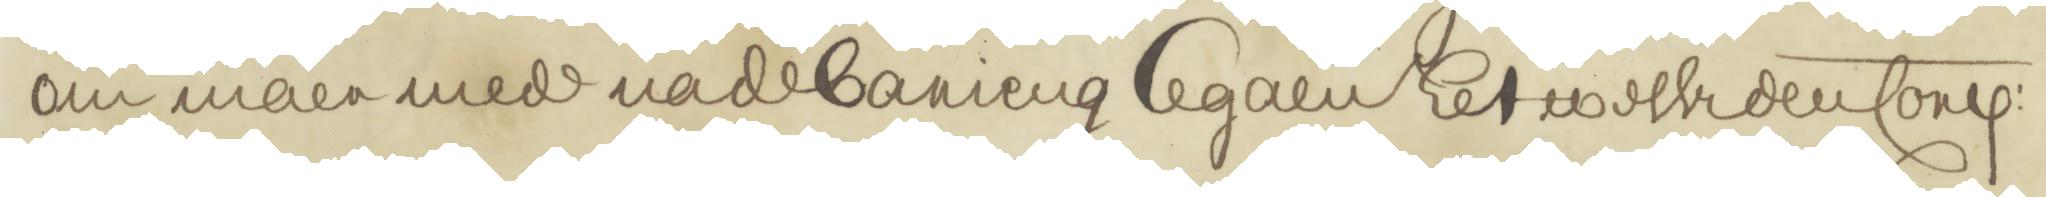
om maer mede nade barieng tegaen het welk den Corp:
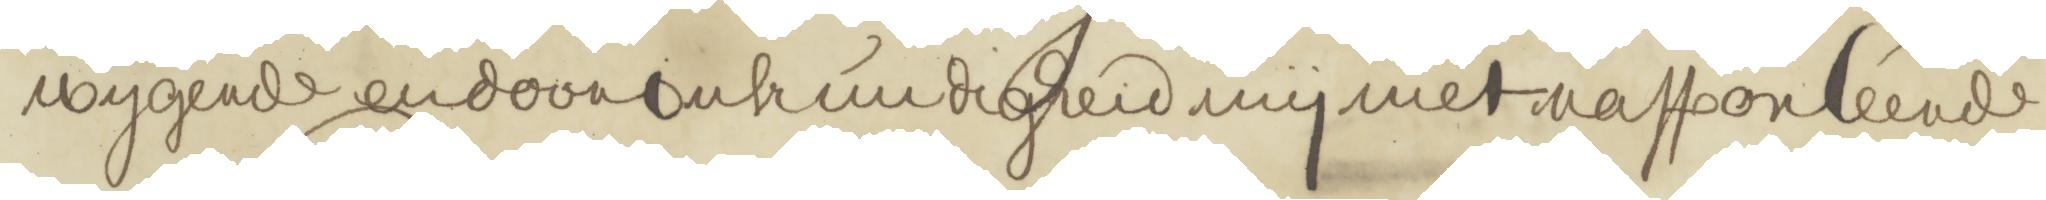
wijgerde en door onkundigheid mij niet rapporteerde
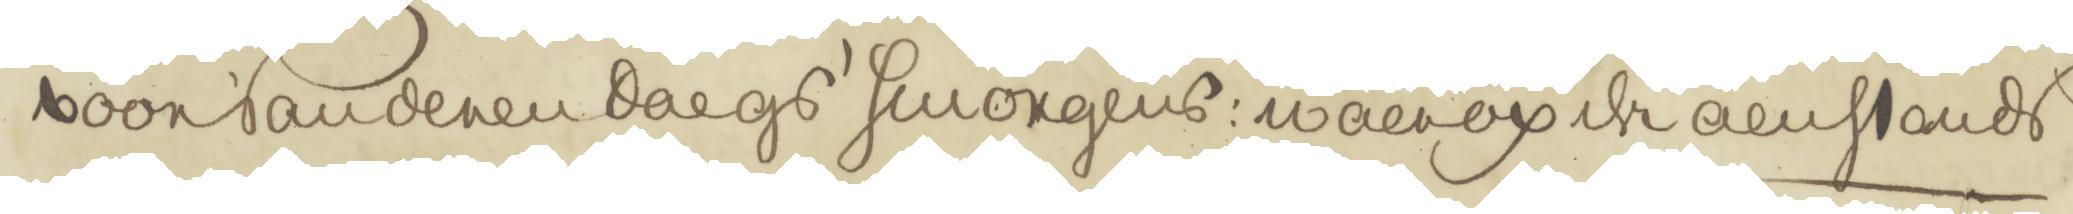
voor ’sanderen daegs 'smorgens: waerop ik aenstonds
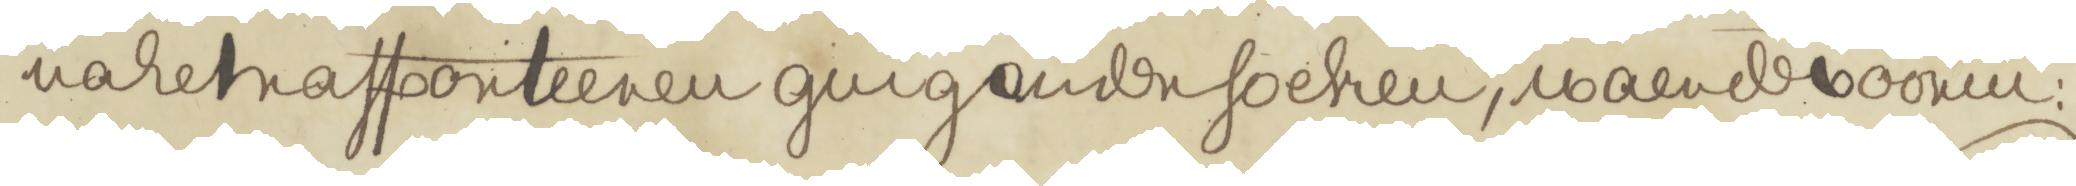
na het rapporteeren ging ondersoeken, waerde voorm:
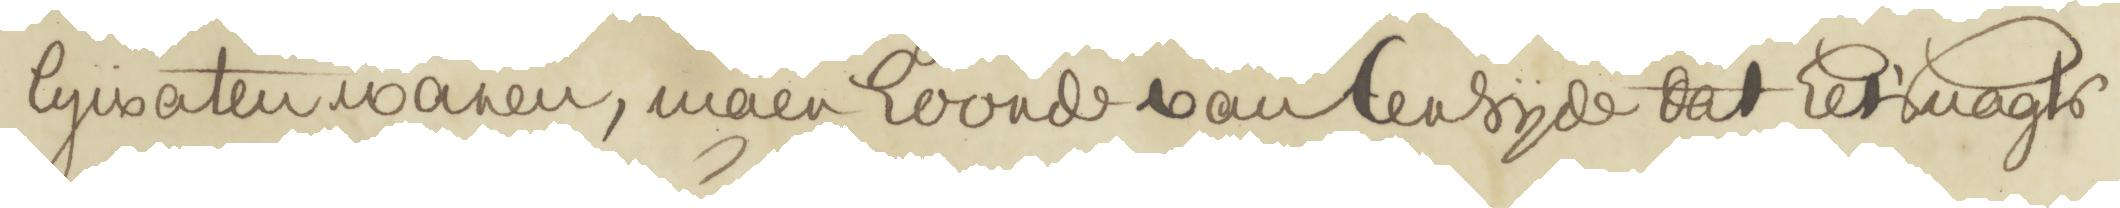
lywaten waren, maer hoorde van tersijde dat het'snagts
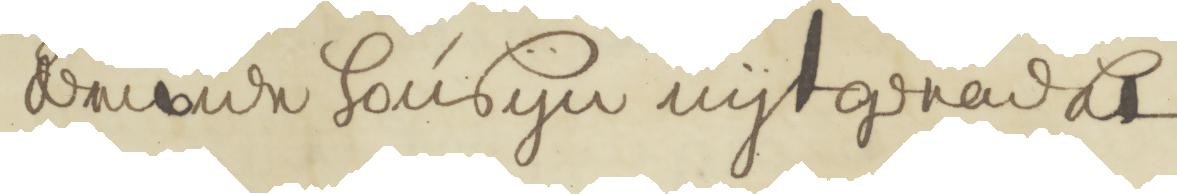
de rivier sousijn uijtgeraekt
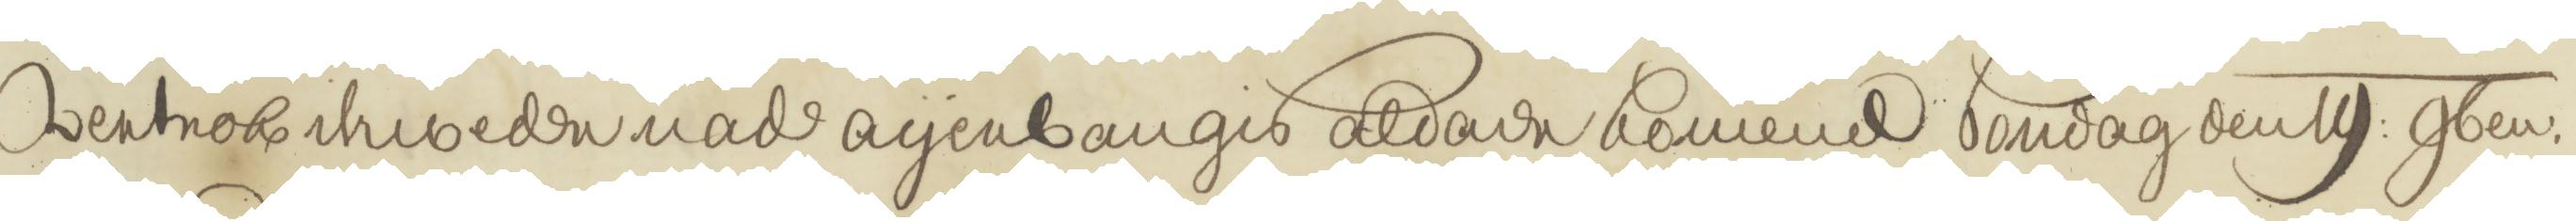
vertrok ik weder nade aijerbangis aldaer komende sondag den 19: 9ber.
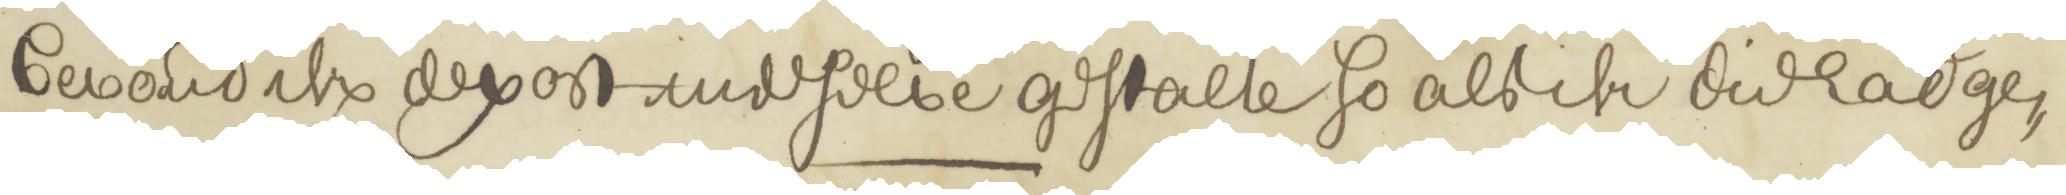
bevond ik de post in deselve gestalte so als ik die had ge„
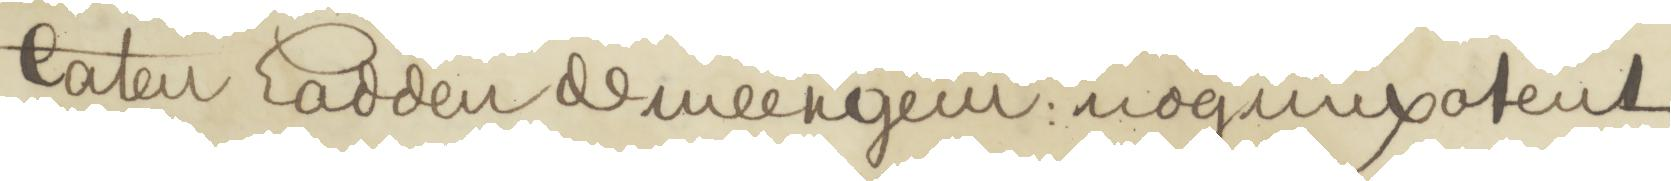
laten hadden de meergem: nog impotent
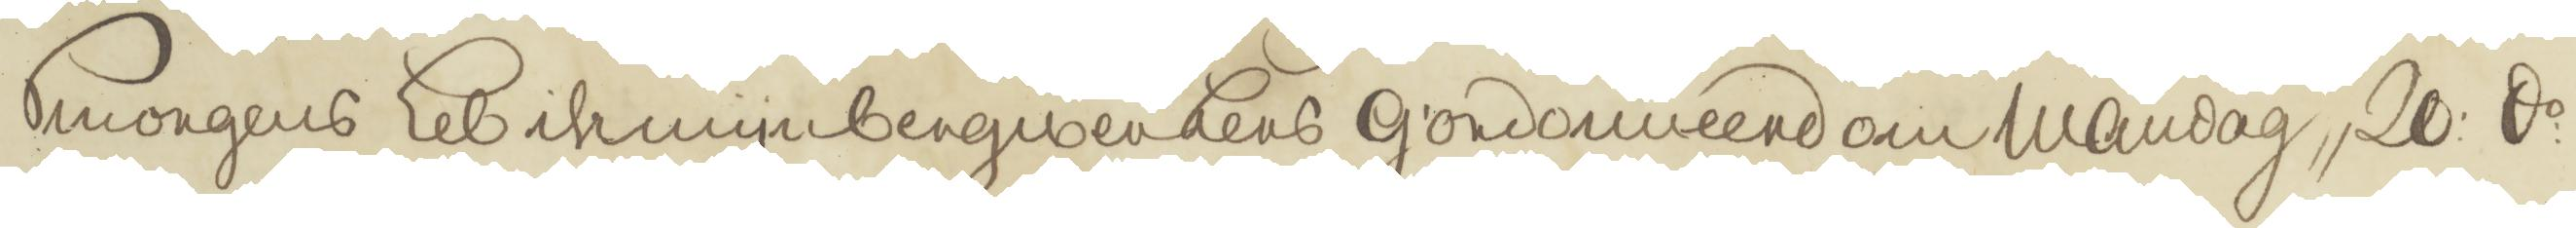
smorgens heb ik mijn bergwerkers g'ordonneerd om Mandag ,,20: d:o
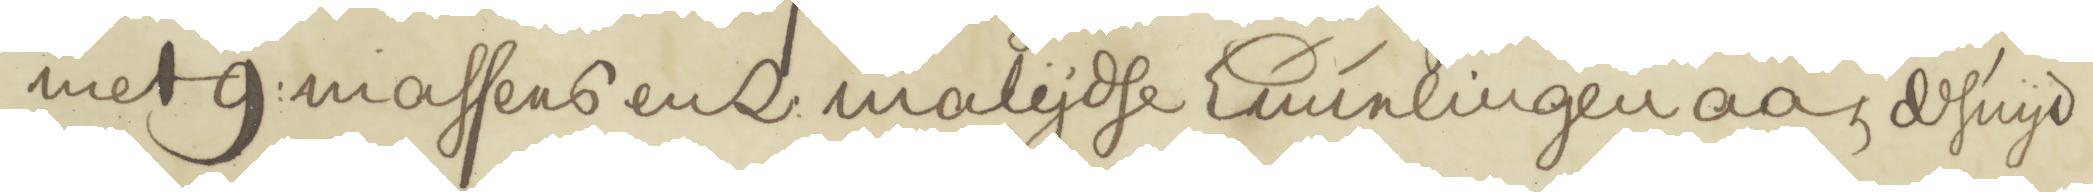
met 9: niassers en 2. malijdse huurlingen aan de suijd
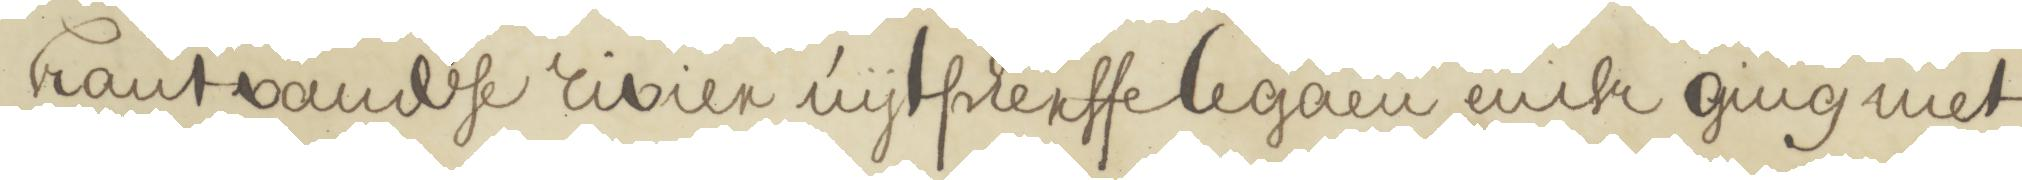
kant van dese rivier uijtscherffe tegaen en ik ging met
